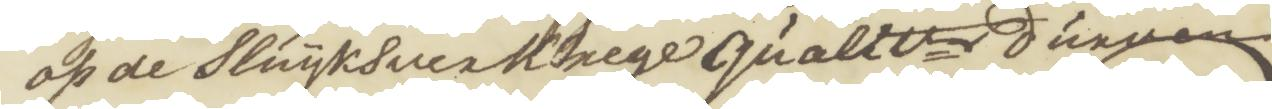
op de sluijks verkrege qualit=en durven
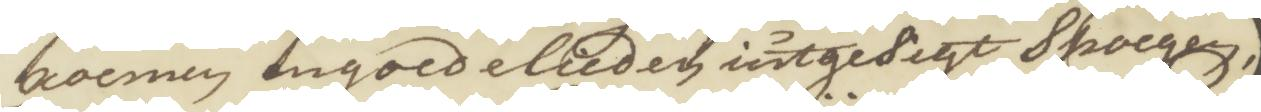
roemen en goede lieden intgesigt spoegen,
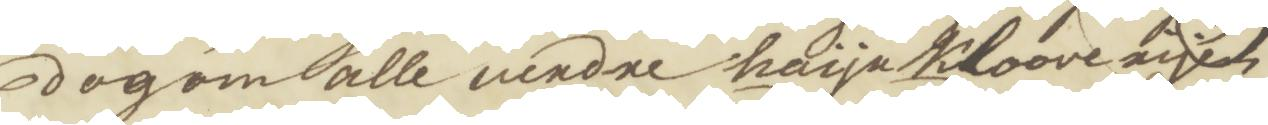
dog om alle verdre haijr kloove rijen
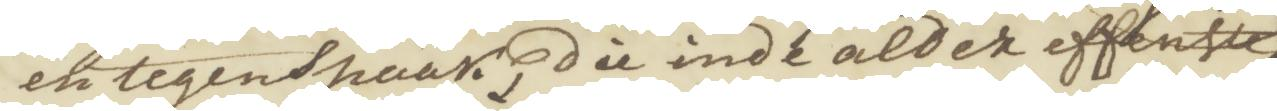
en tegenspaak, die inde alder effenste
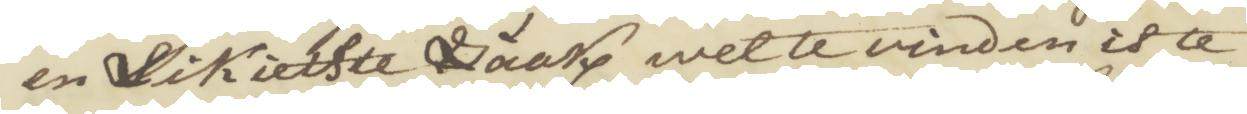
en Likietste zaak wel te vinden is te
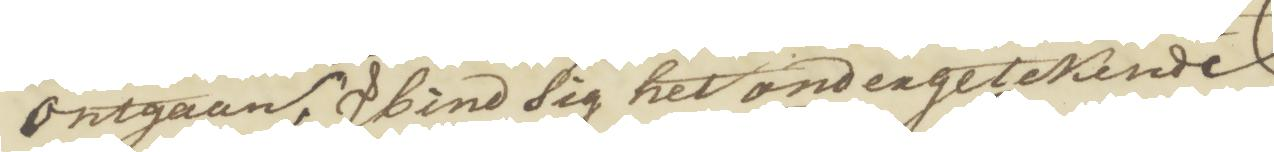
ontgaan, verbind sig het ondergetekende
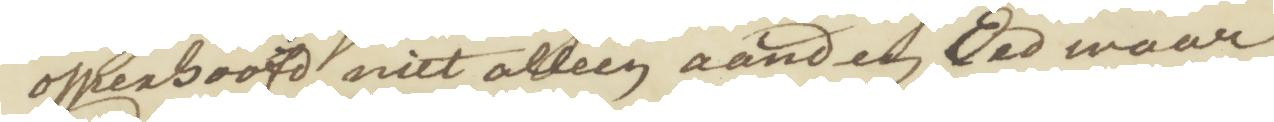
opperhoofd niet alleen aanden Eed waar
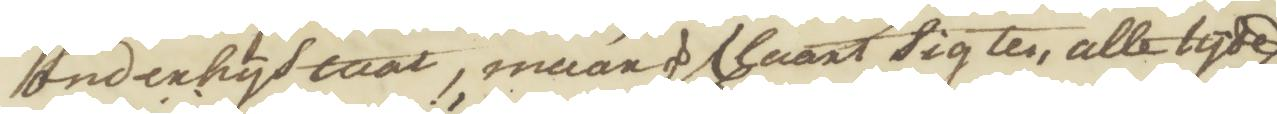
onder hij staat, maar verclaart sig ten alle tijde
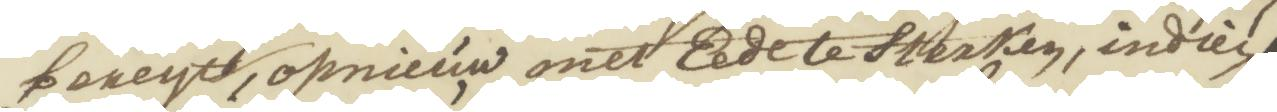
bereijt, opnieuw met Eede te sterken, indien
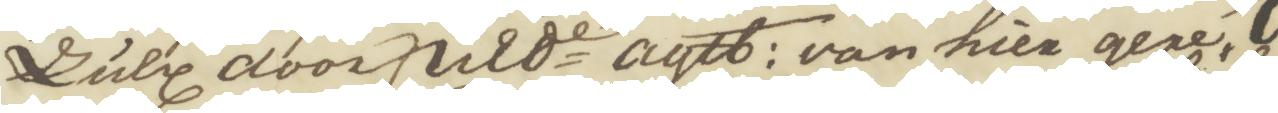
zulx door uEd=e agtb: van hier gere
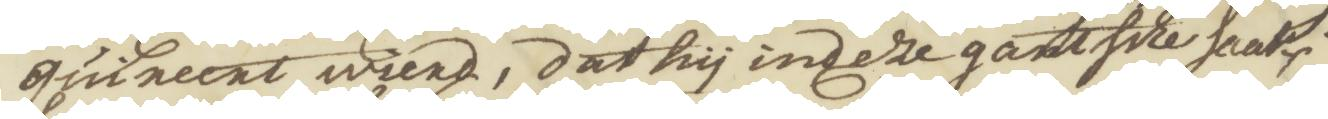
quireert wierd, dat hij indeze gantsche saak
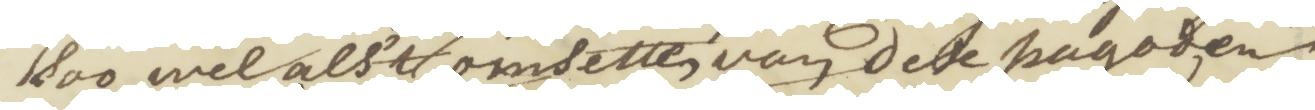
soo wel als 't omsetten van dese pagoden,
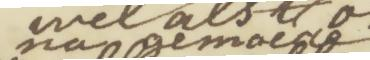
^na gemaecte
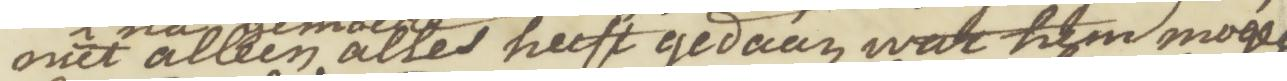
niet alleen ^ alles heeft gedaan wat hem moge
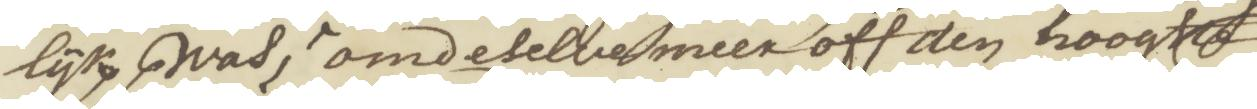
lijk was, om deselve meer off den hoogte
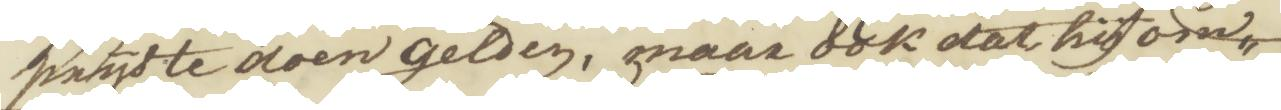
prijste doen gelden, maar ook dat hij om„
